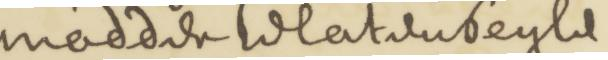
modder te laten seyle
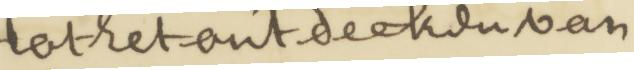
tot het ontdecken van
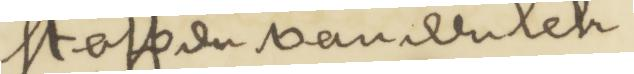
stoppen van een lek
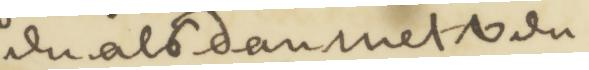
en als dan met ven
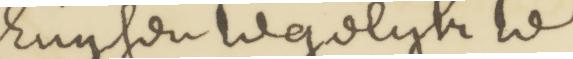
huijsen te gelyk te
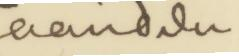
aanden
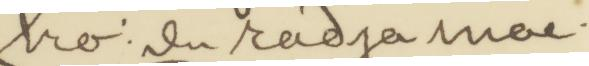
ko: en radja moe
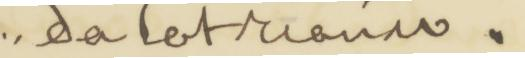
„da tot riouw.
